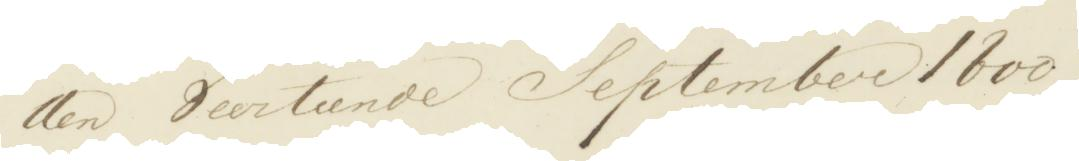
den Veertiende September 1800
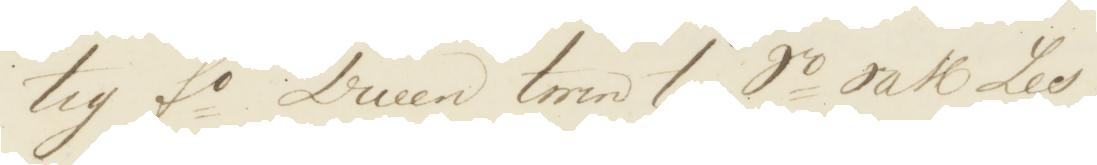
tig f=o Drieen twintig V=o vak Zes
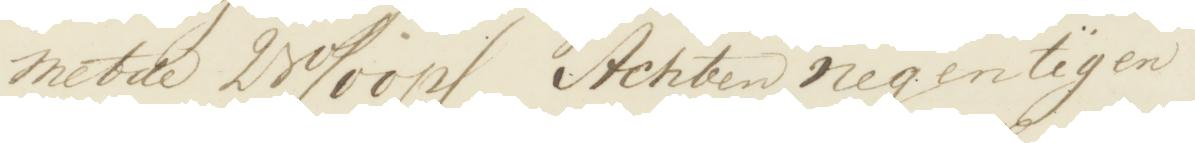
metde 28% opC Achten negentig en
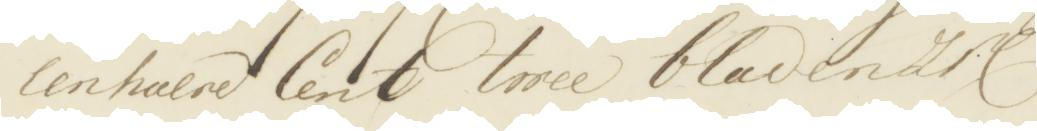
een halve Cent twee bladen zr
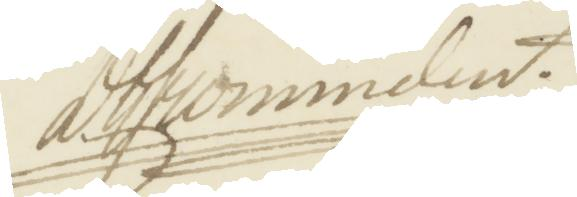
D.F Crommelin.
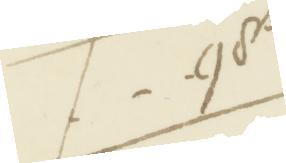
ƒ - .98½
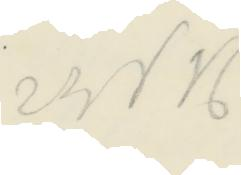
23VV6
